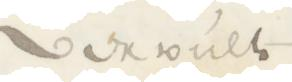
vervult
